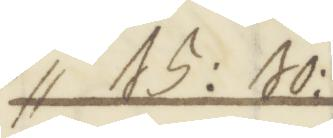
„ 15: 10: 2/5. r„o
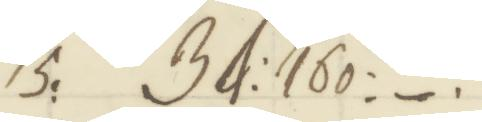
8: 2: 2/5: 34: 39/160: — .
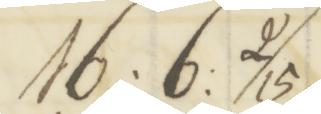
16: 6: 2/15.
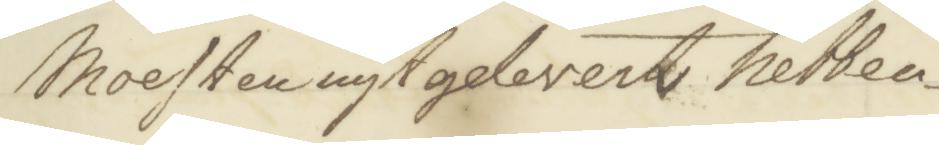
Moesten uytgelevert hebben
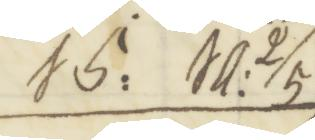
15: 44: 2/5.
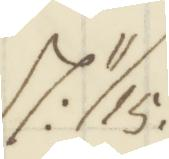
7: 11/15
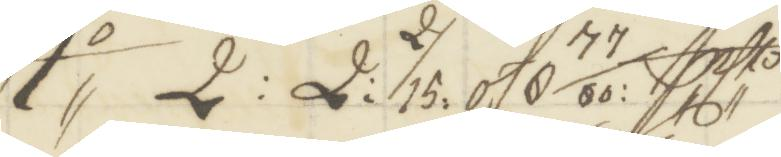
r„o 2: 2: 2/15: of 8 77/80: p„rC„to r„m
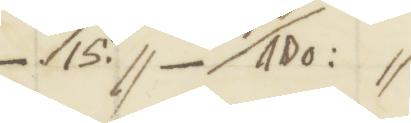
— 8/15. „ — 67/480: „
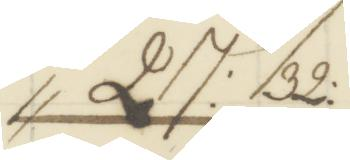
„ 27: 9/32:
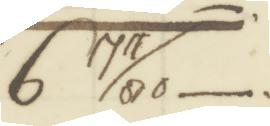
6 74/80
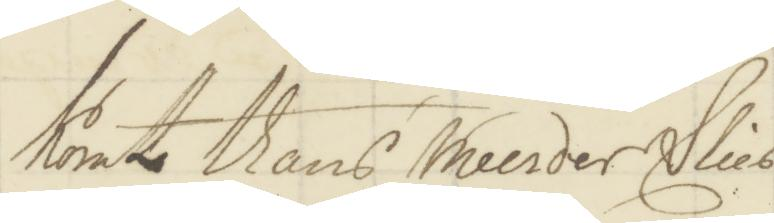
Komt thans meerder verlies
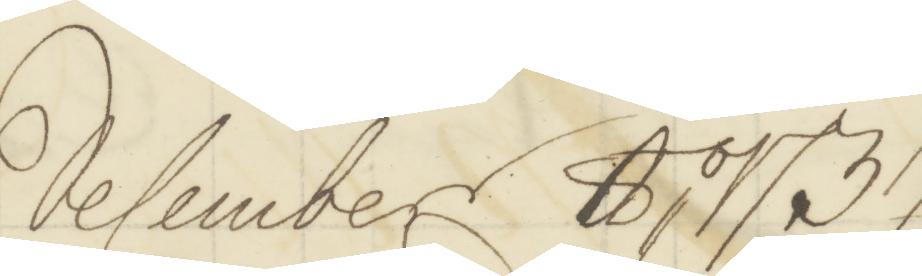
december A„o 1737:
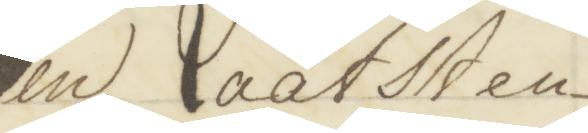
Den Laatsten
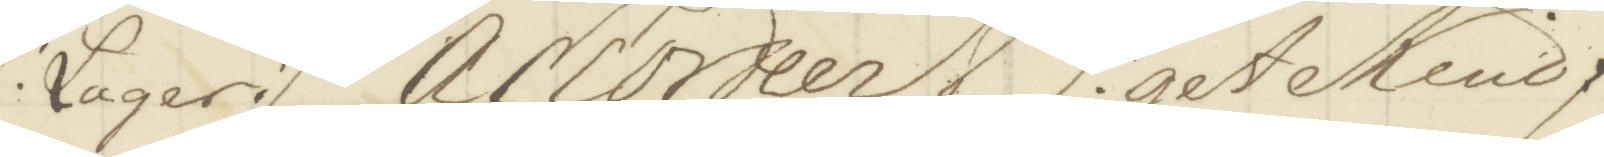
/:Lager:/ Accordeert /:getekend/
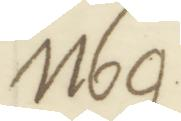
1169.
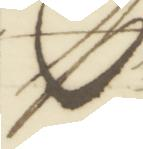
PrC=t
